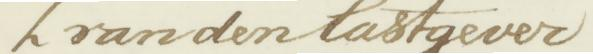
van den lastgever
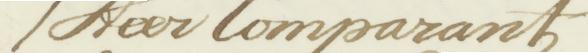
¶ Heer Comparant
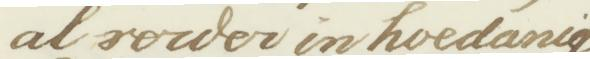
al verder in hoedanig
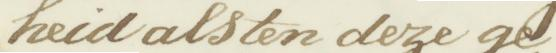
heid als ten deze ge
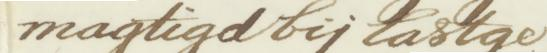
magtigd bij lastge
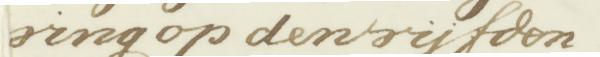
ving op den vijfden
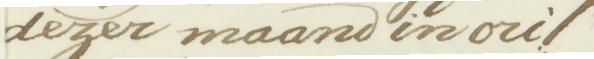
dezer maand in ori„
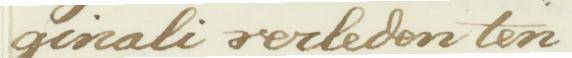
ginali verleden ten
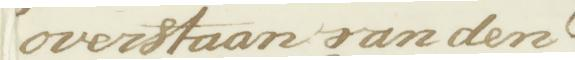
overstaan van den
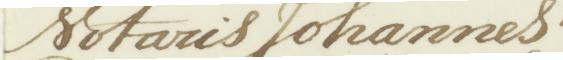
Notaris Johannes
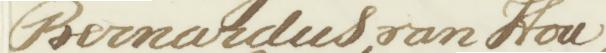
Bernardus van Hou
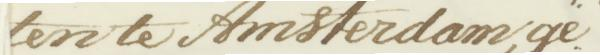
ten te Amsterdam, ge„
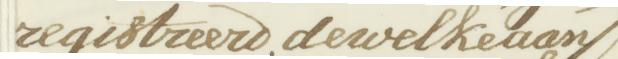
registreerd, dewelke aan
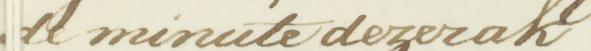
te minute dezer ak.
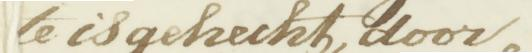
te is gehecht, door
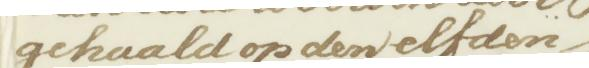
gehaald op den elfden
